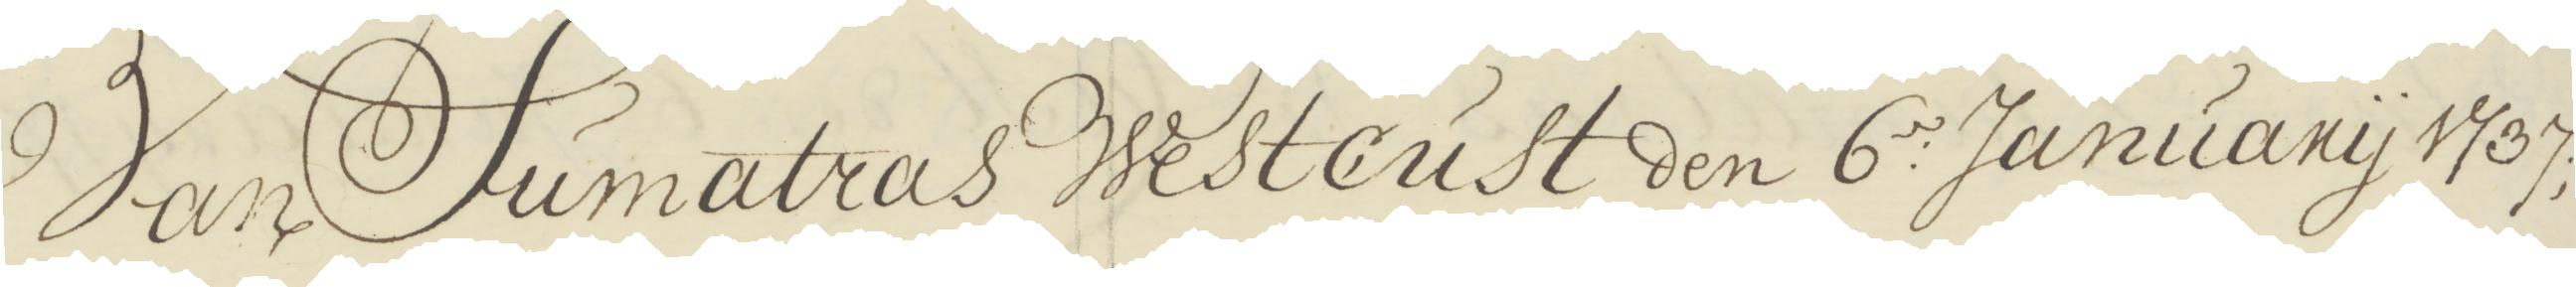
Van Sumatras Westcust den 6:n Januarij 1737;_.
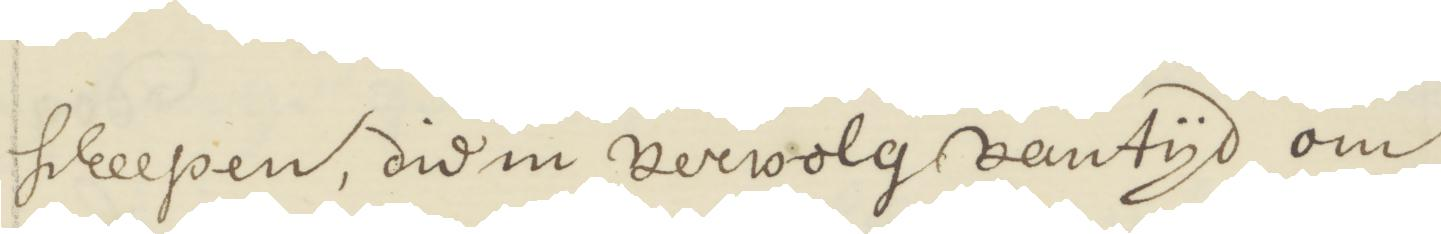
scheepen, die in vervolg van tijd om
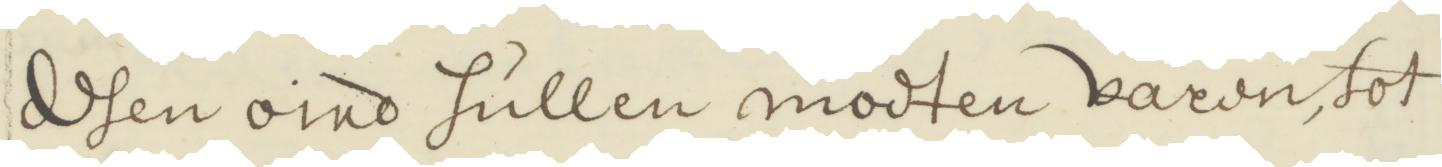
desen oird sullen moeten varen, tot
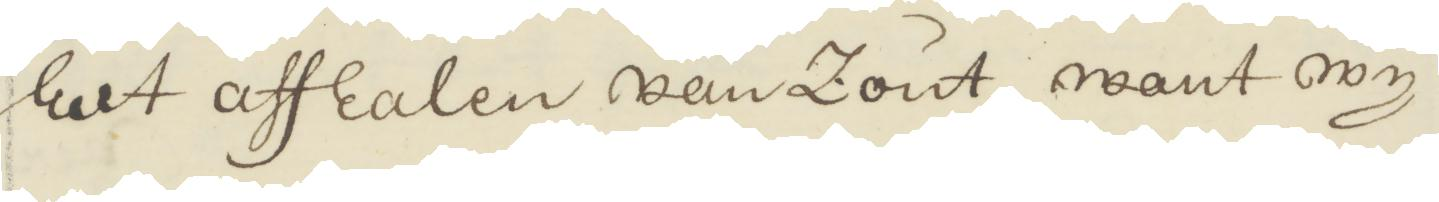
het affhalen van zout want wij
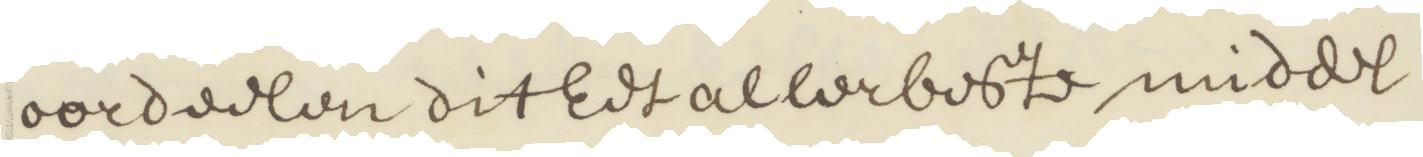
oordeelen dit het allerbeste middel
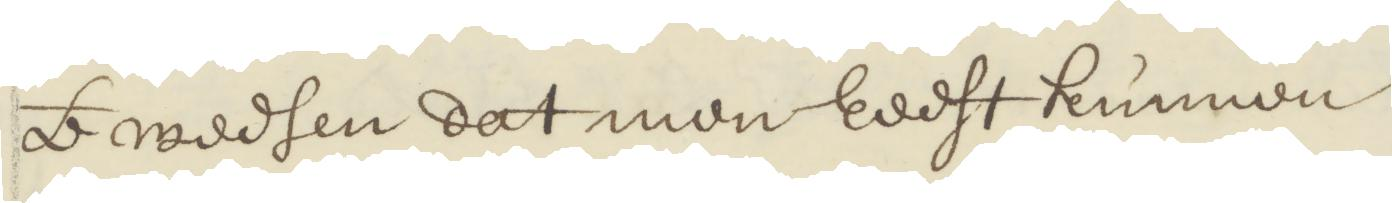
te weesen dat men heeft kunnen
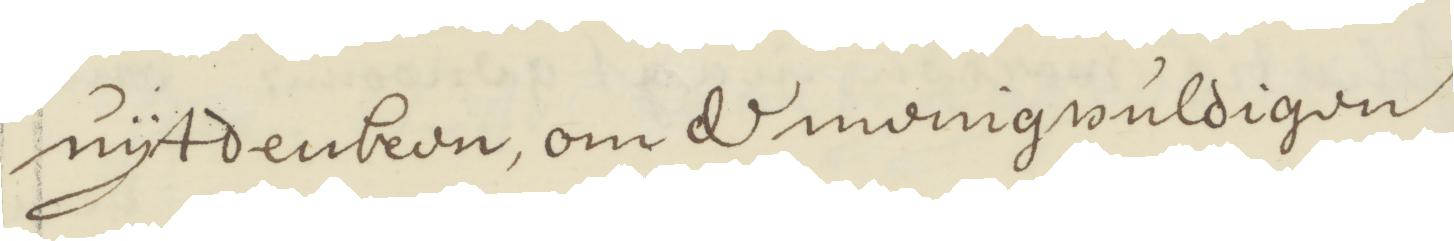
uijtdenken, om de menigvuldigen
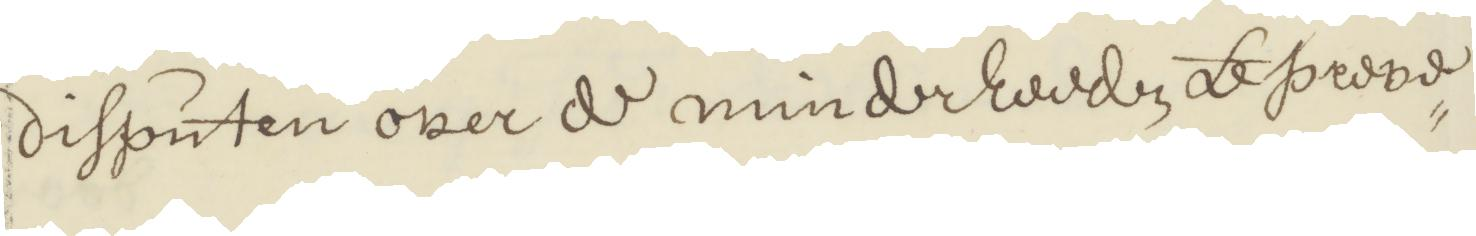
disputen over de minderheeden te preve„
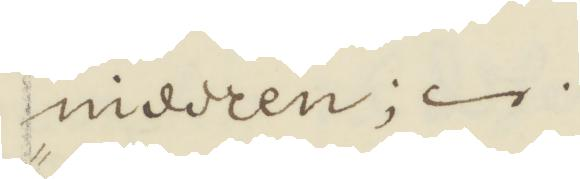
nieeren; —.
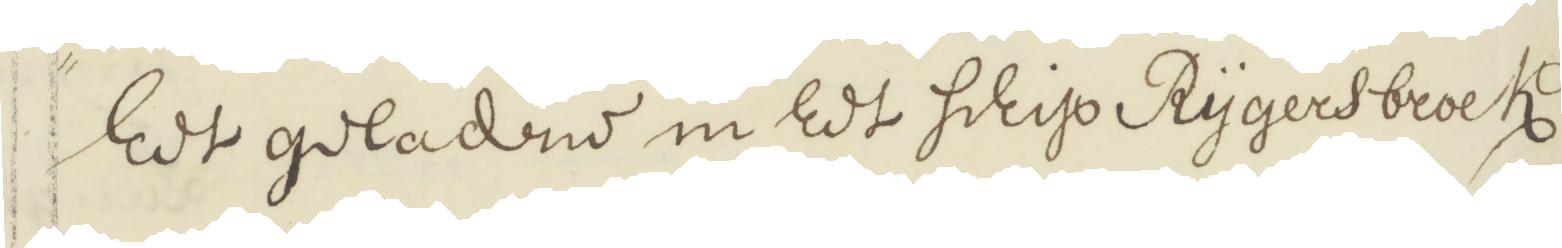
het geladene in het schip Rijgersbroek
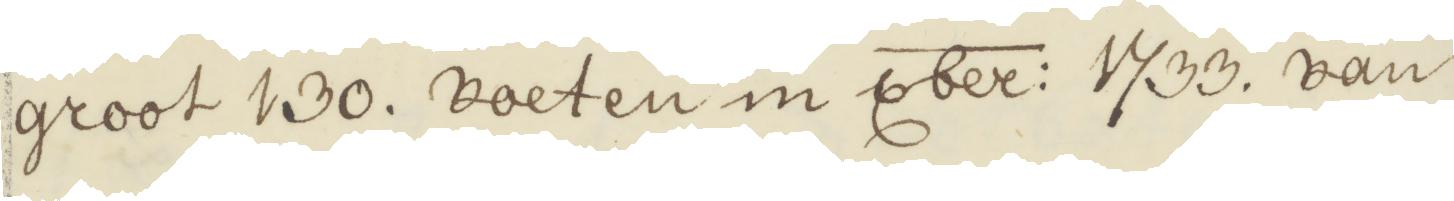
groot 130. voeten in xber: 1733. van
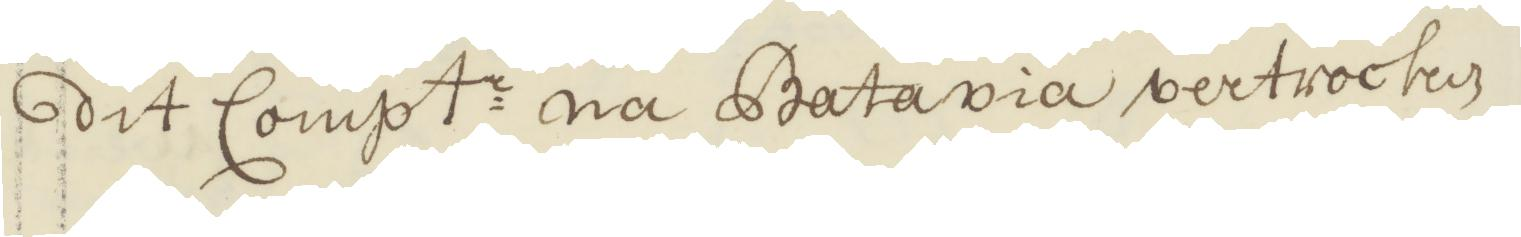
dit Compt:r na Batavia vertrocken
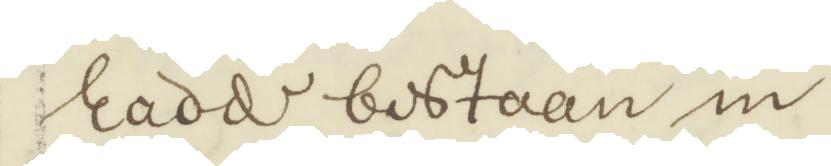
hadde bestaan in
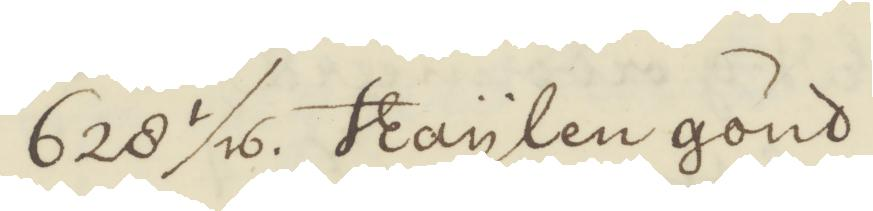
6281/16. thaijlen goud
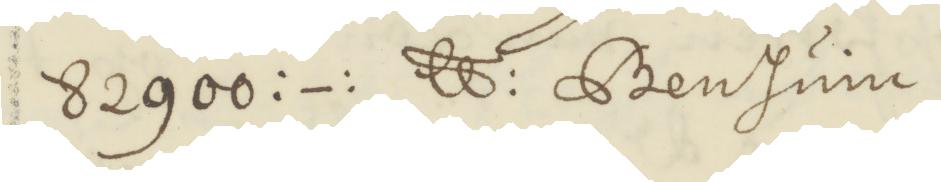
82900:–: lb: Benzuin
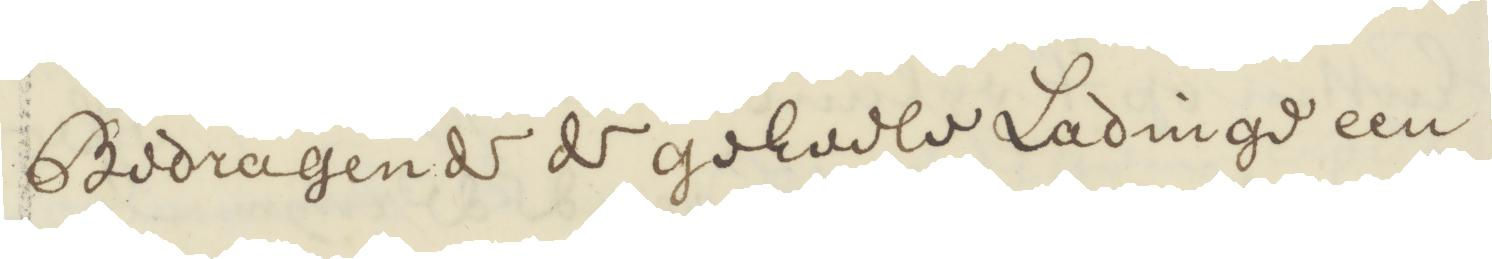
Bedragende de geheele ladinge een
